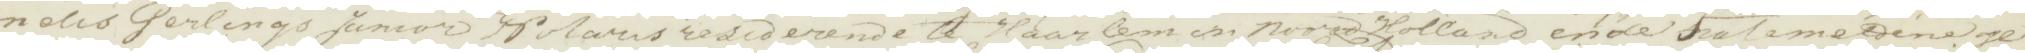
nelis Gerlings Junior Notaris residerende te Haarlem in Noord Holland en de natemeldene ge
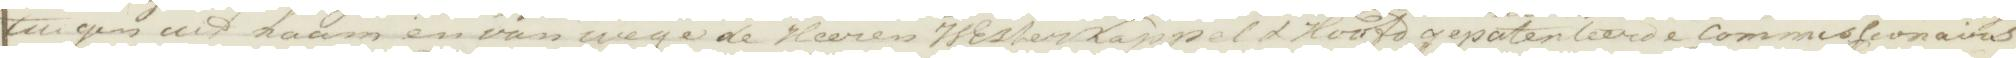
tuigen uit naam en van wege de Heeren Westerkappel & Hoofd gepatenteerde Commissiars
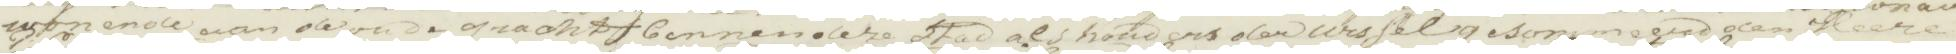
wonende aan de oude gracht binnen deze Stad als houders der wissel gesommeerd den Heer
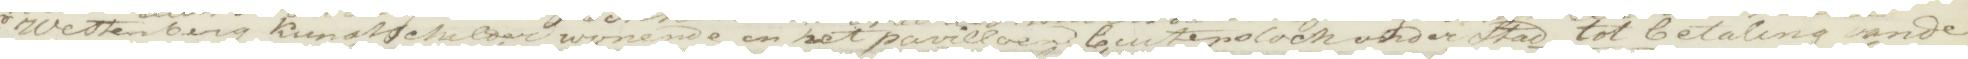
I. G. Westenberg kunstschilder wonende in het pavilloen Comte polack onder stad tot betaling vande
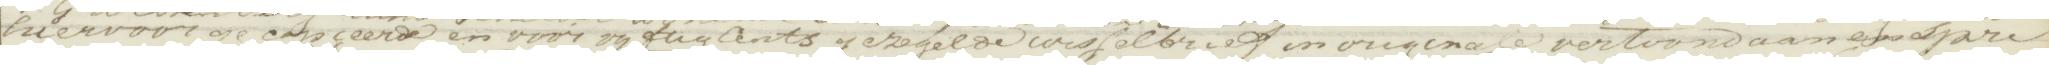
hiervoor gecopieerde en voor vyftig Cents gezegelde wisselbrief in originale vertoond aan en spre
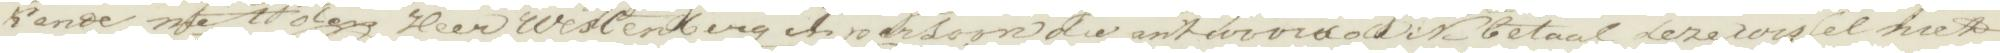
kende met den Heer Westenberg in persoon die antwoordde ik betaal deze wissel niet
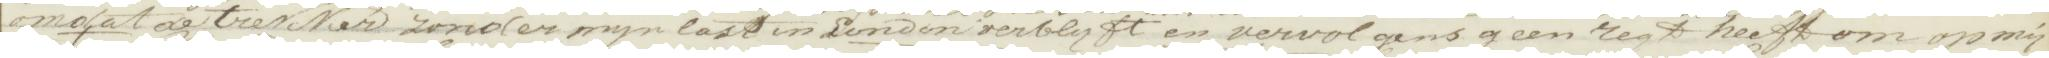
omdat de trekker zonder myn last in London verblyft en vervolgens geen regt heeft om op mij
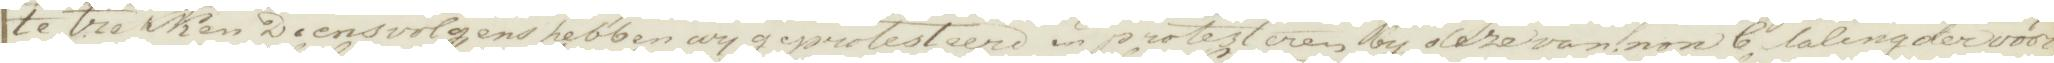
te trekken Diensvolgens hebben wy geprotesteerd en protesteren by deze van non betaling der voor
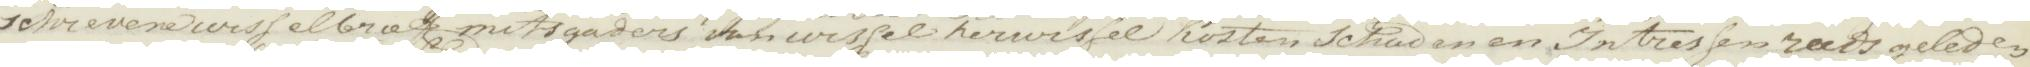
schrevene wisselbrief mitsgaders van wissel herwissel kosten schaden en Intressen reeds geleden
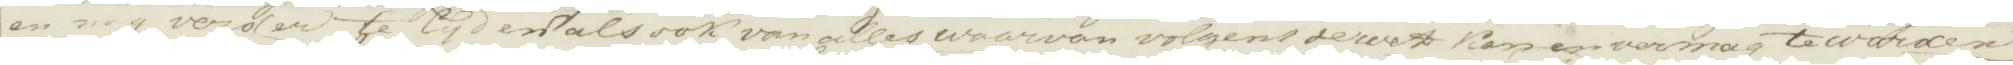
en nog verder te lyden als ook van alles waarvan volgens de wet kan en vermag te worden
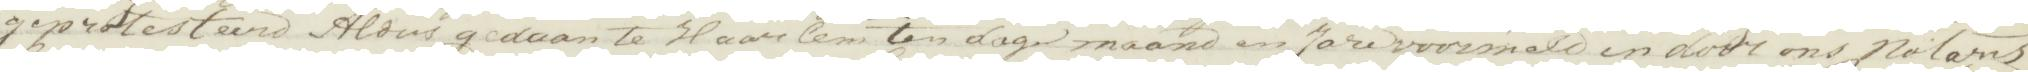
geprotesteerd Aldus gedaan te Haarlem ten dage maand en Jare voormeld in door ons Notaris
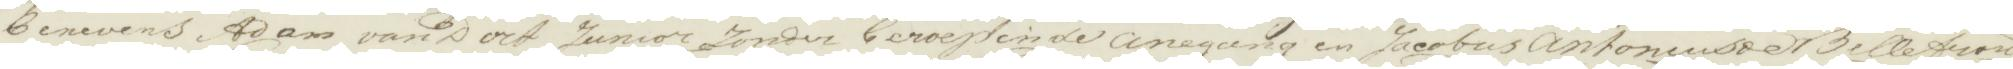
benevens, Adam van Dort Junior zonder beroep in de Anegang en Jacobus Antonius de Bellefroid
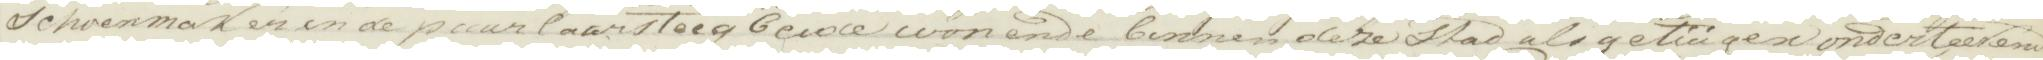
Schoenmaker in de paarlaarsteeg beide wonende binnen deze stad als getuigen onderteekend
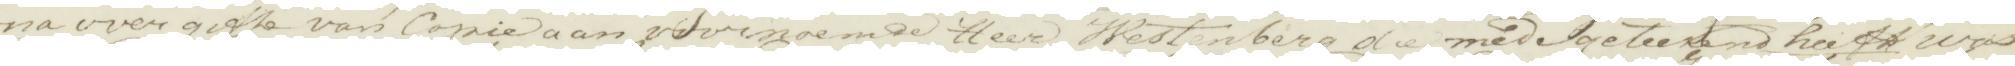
na overgifte van Copie aan voornoemde Heer Westenberg die mede geteekend heeft / was
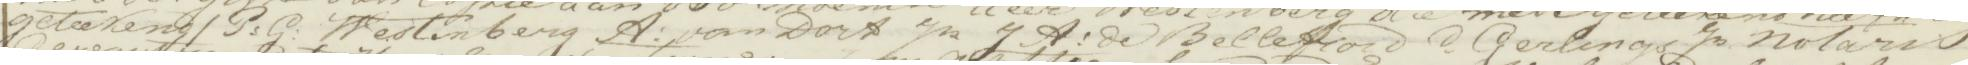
geteekend / P: G: Westenberg A: van Dort Jr. J A: de Bellefroid C Gerlings Jr. notaris
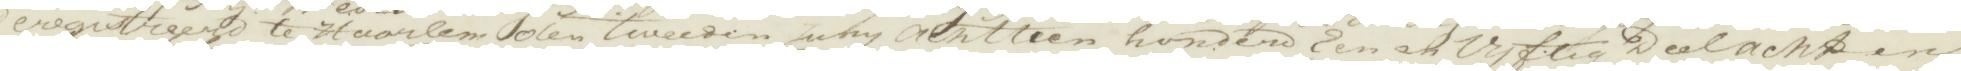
Geregistreerd te Haarlem den tweeden Juny achttien honderd Een en Vyftig Deel acht en
